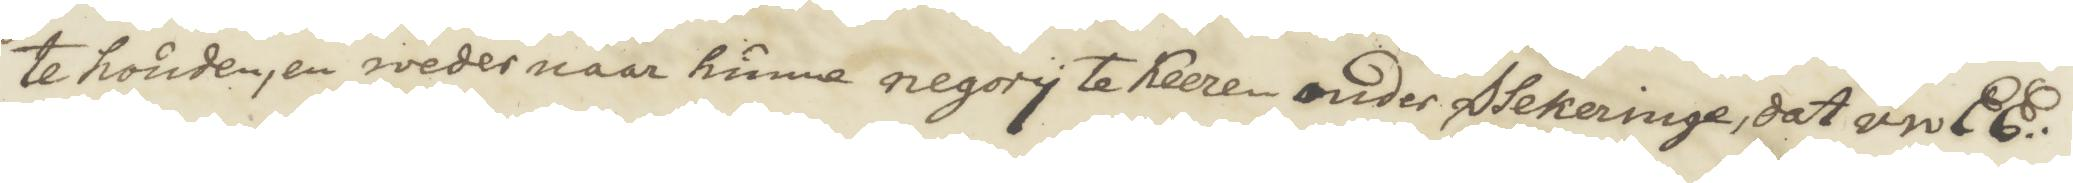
te houden, en weder naar hunne negorij te keeren onder versekeringe, dat uw EE:
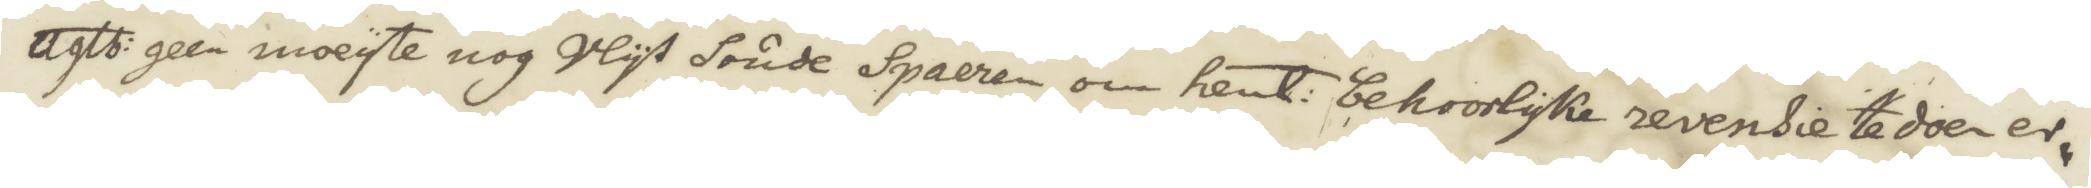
agtb: geen moeijte nog vlijs soude spaeren om henl: behoorlijke revensie te doen er„
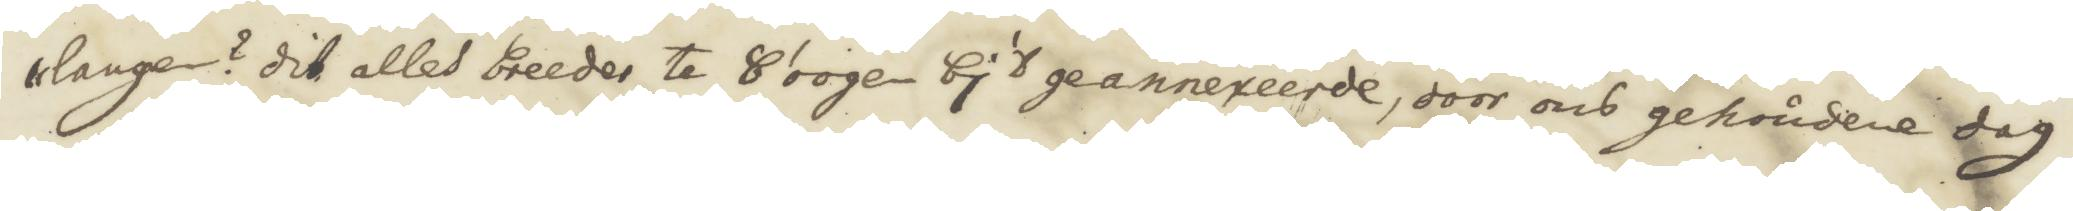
langen ? dit alles breeder te b'oogen bij ’t geannexeerde, door ons gehoudene dag
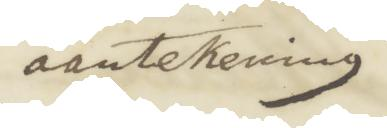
aantekening
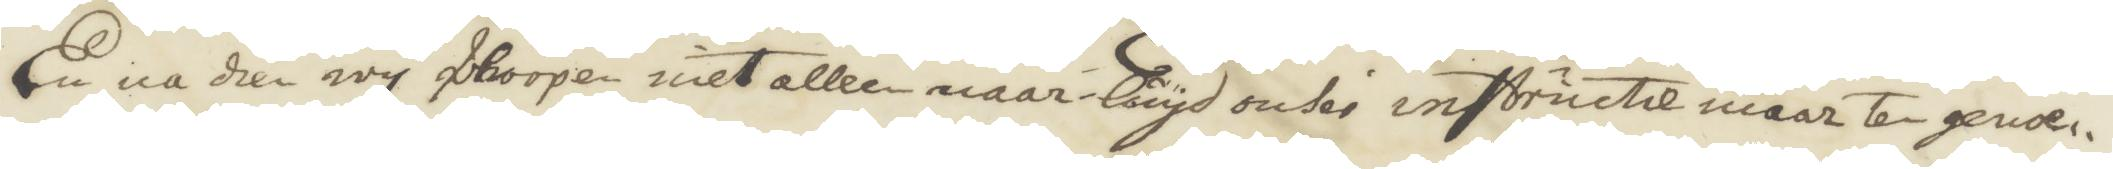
En na dien wij verhoopen niet alleen naar luijd onser instructie maar ten genoe„„
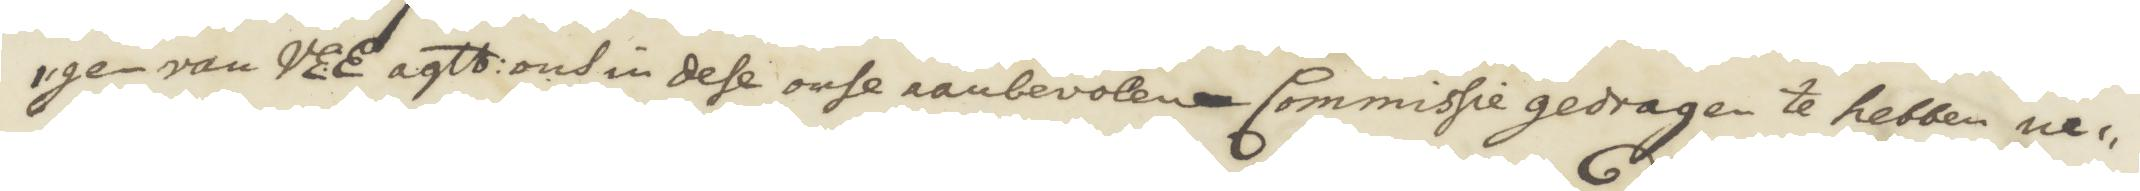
„gen van VE.E agtb: ons in dese onse aanbevolene Commissie gedragen te hebben ne„
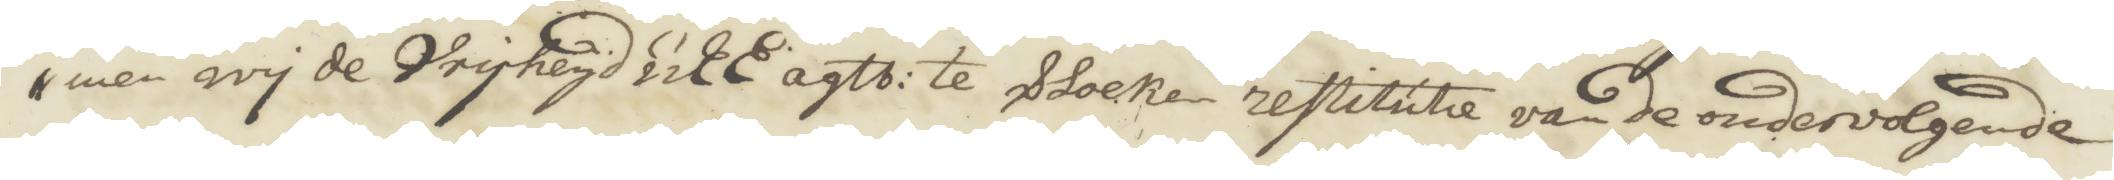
„men wij de Vrijheijd uEE agtb: te versoeken restitutie van de ondervolgende
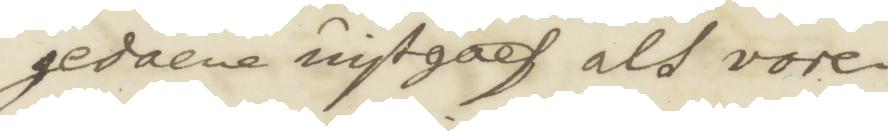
gedaene uijtgaef als voren
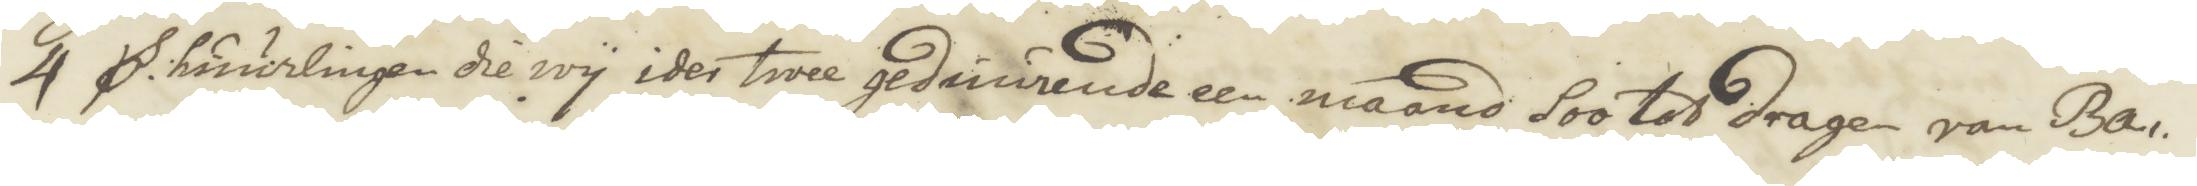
4 p.s huurlingen die wij ider twee geduurende een maand soo tot drage van Ba„
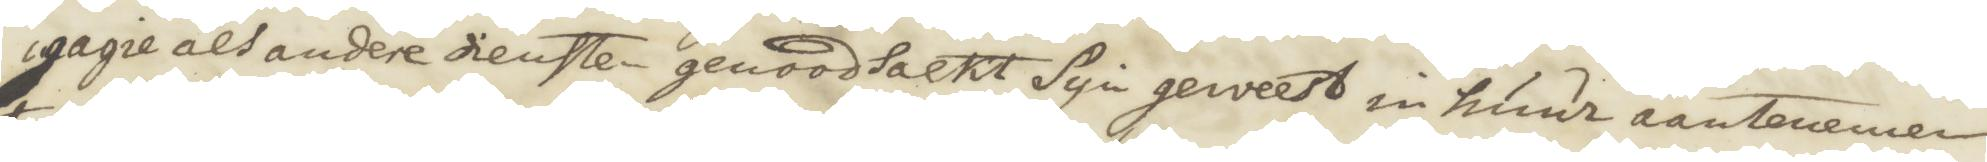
„gagie als andere diensten genoodsaekt sijn geweest in huur aantenemen
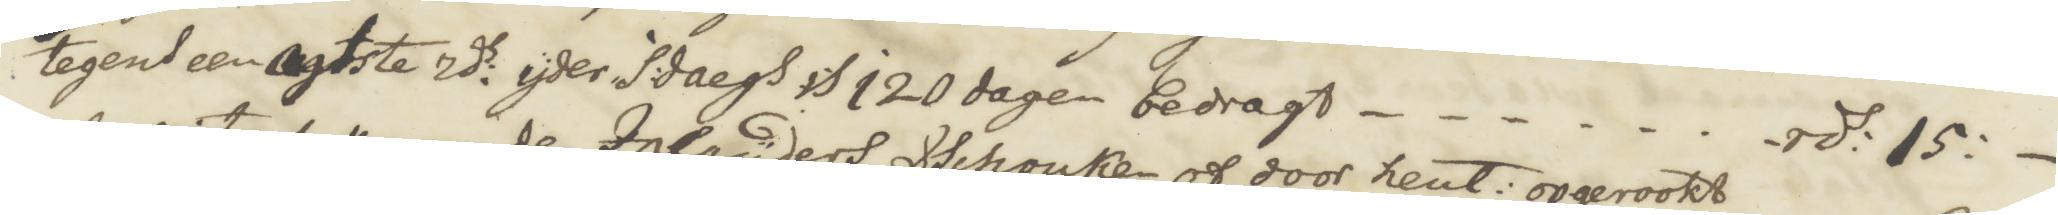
tegens een agtste rd:s ijder 'sdaegs is 120 dagen bedragt - - - - - . - rd:s 15: —
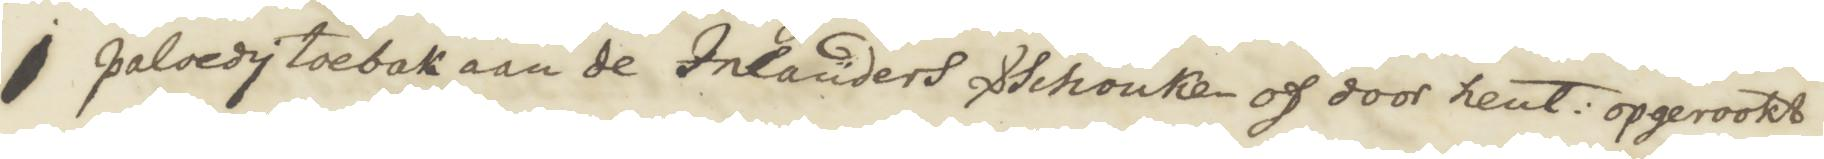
1 paloedij toebak aan de Inlanders verschonken of door henl: opgerookt
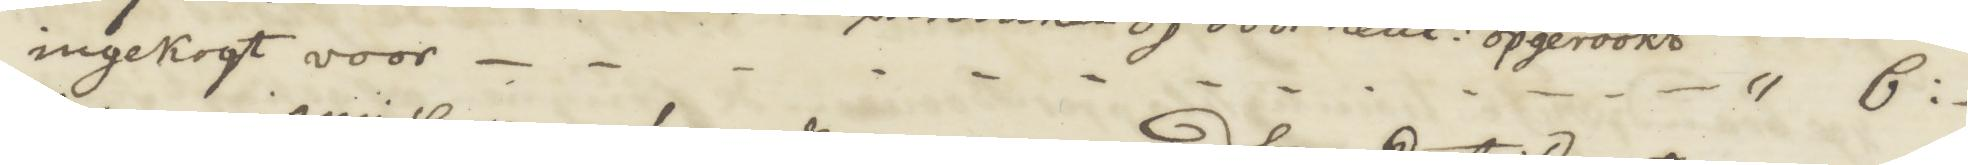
ingekogt voor - - - - - - - - - - - - - „ 6:
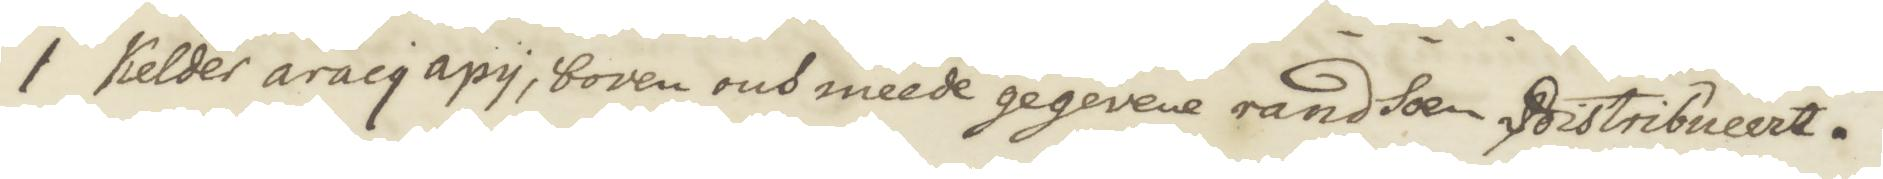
1 kelder aracq apij, boven ons meede gegevene randsoen verdistribueert.
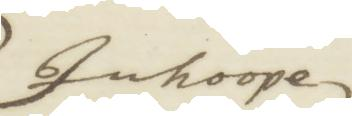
Jnhoope
